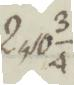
2„10¾
